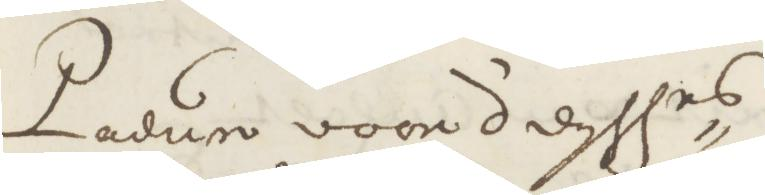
Paeuw voor deyss„rs
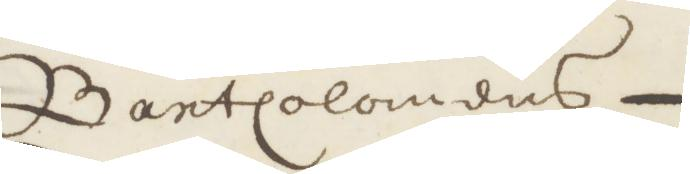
P=a Bartholomeus —
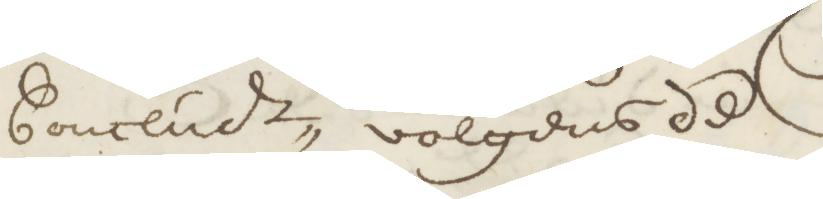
Conclud„t, volgens de
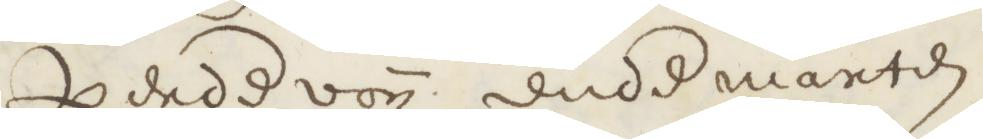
Derde voij. ende marten
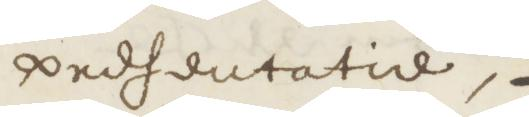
presentatie, —
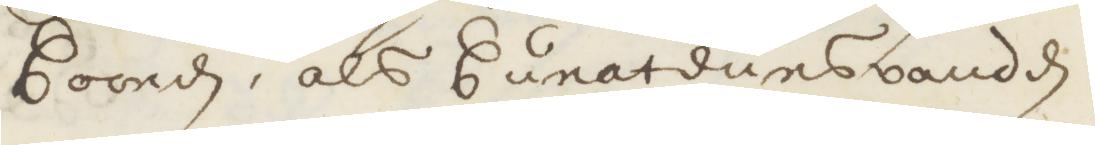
Cooren, als Curateurs vanden
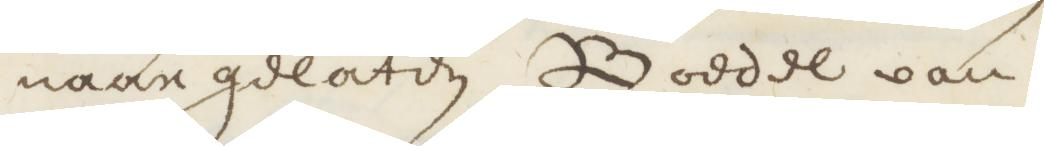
naar gelaten Boedel van
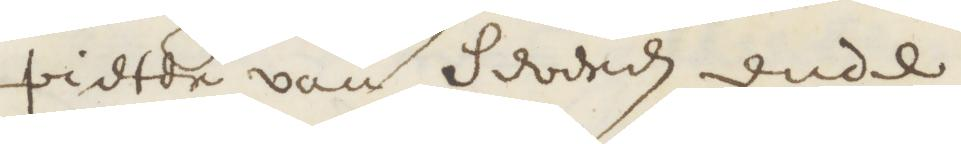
pieter van severen ende
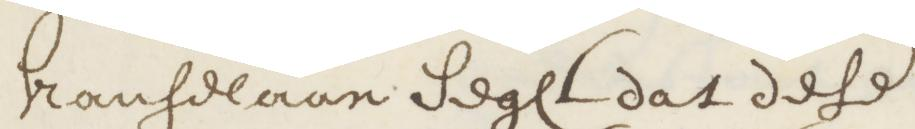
kanselaar seght dat dese
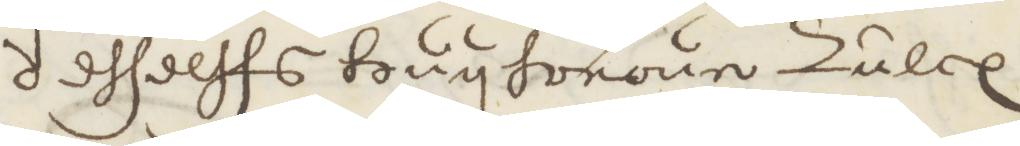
desselffs huijsvrouw zulcx
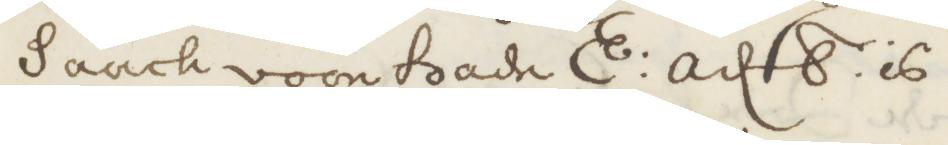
saack voor haer E: achtb: is
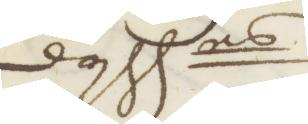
eyss=rs
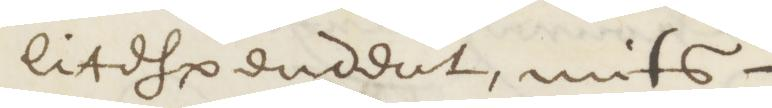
litespendent, mits —
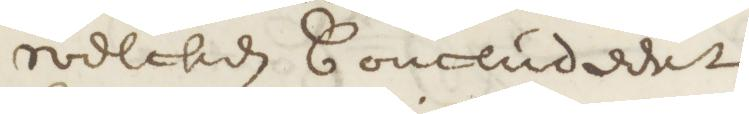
welcken Concludeert
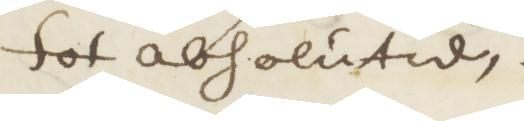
tot absolutie, —
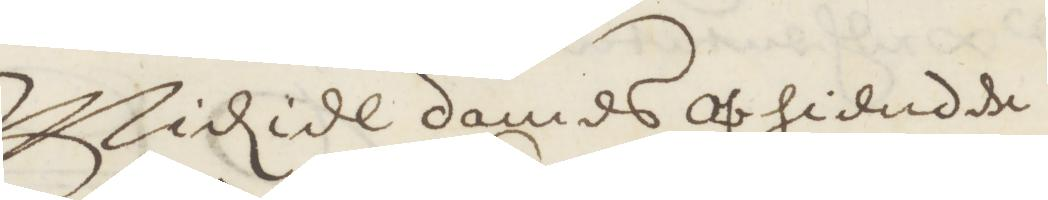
Michiel danies opsiender
